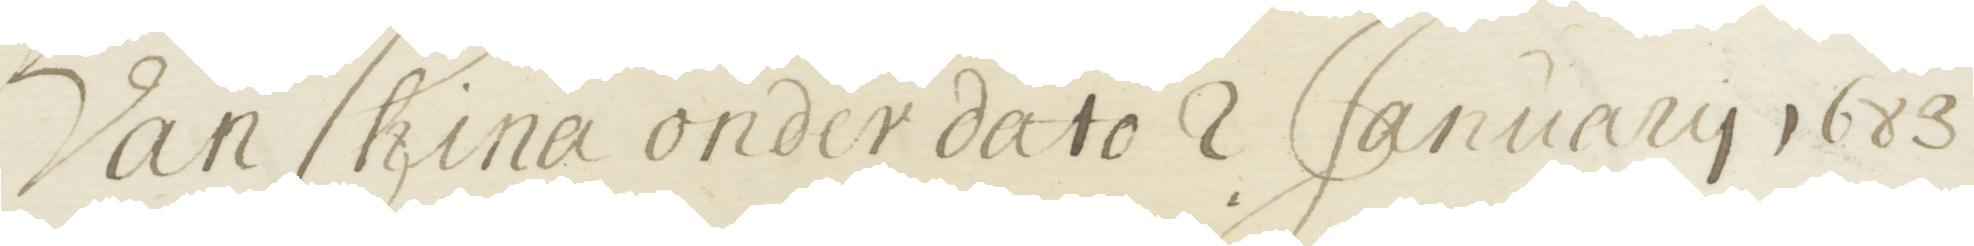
Van China onder dato 2 Januarij 1683
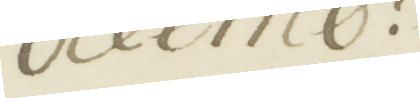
decemb:
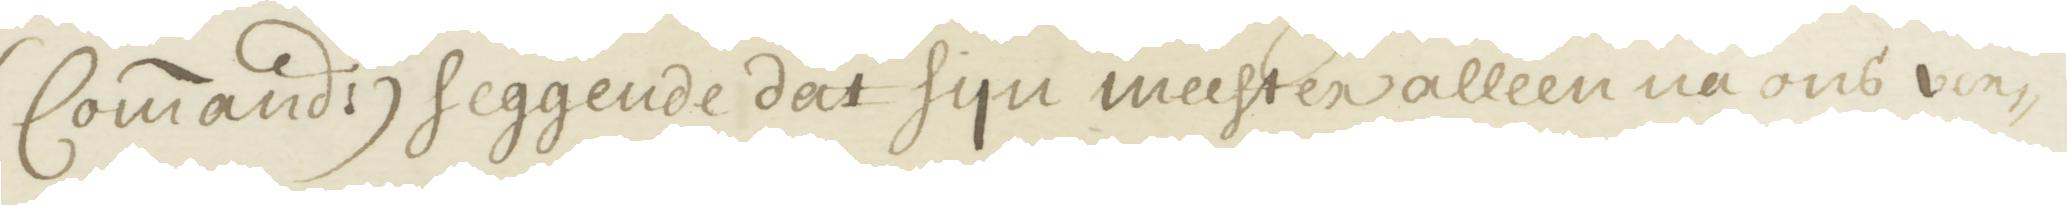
Comand:) seggende dat sijn meester alleen na ons ver„
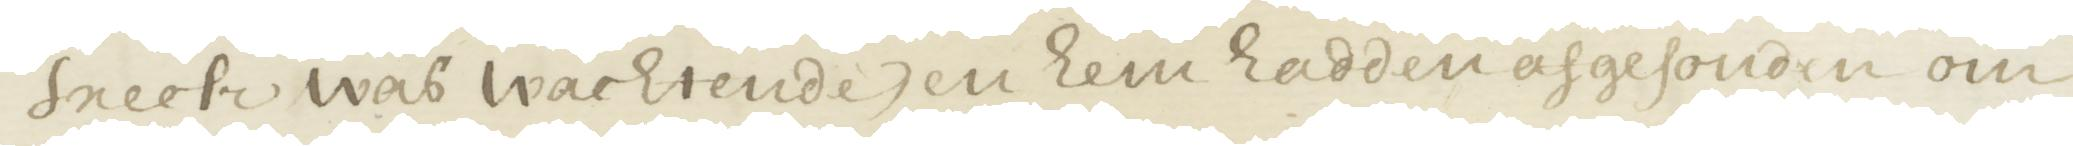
treek was wachtende ) en hem hadden afgesonden om
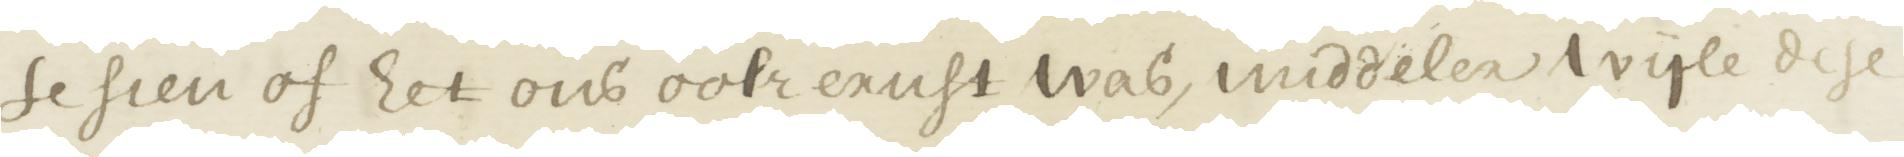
te sien of het ons ook ernst was, middeler wijle dese
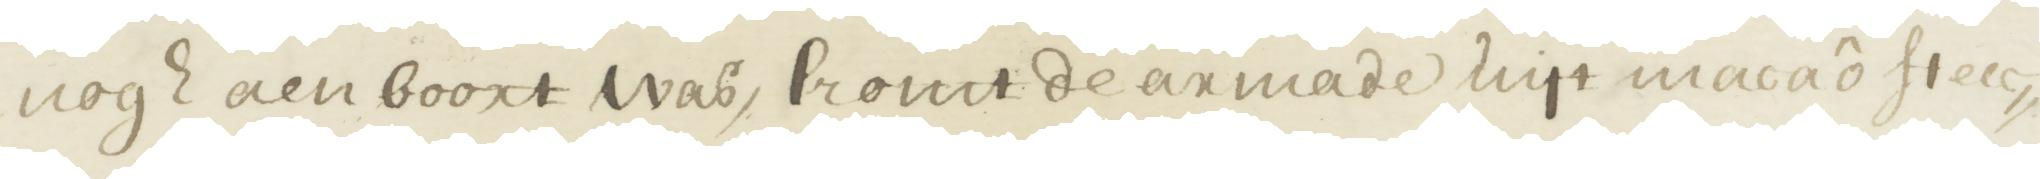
nogh aen boort was, komt de armade uijt macaô steec„
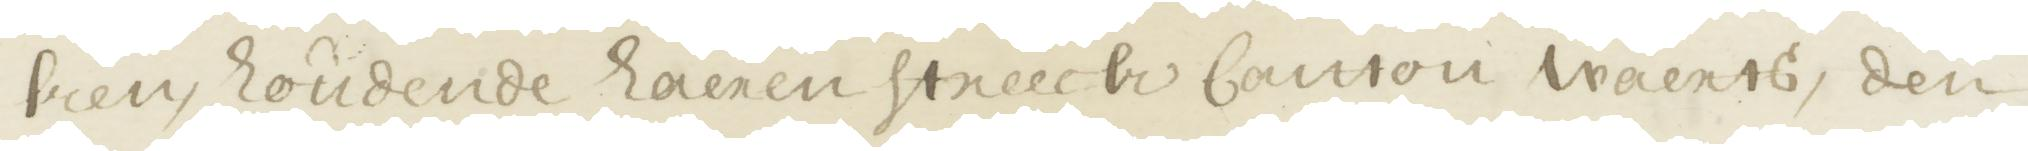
ken, houdende haeren streeck canton waerts, den
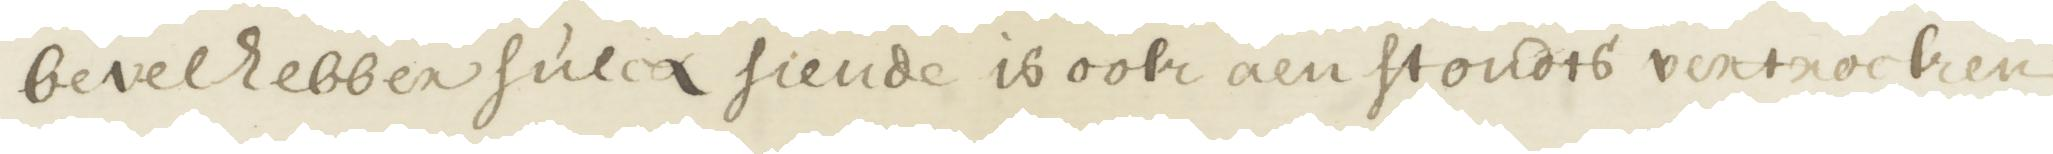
bevelhebber sulcx siende is ook aen stondts vertrocken
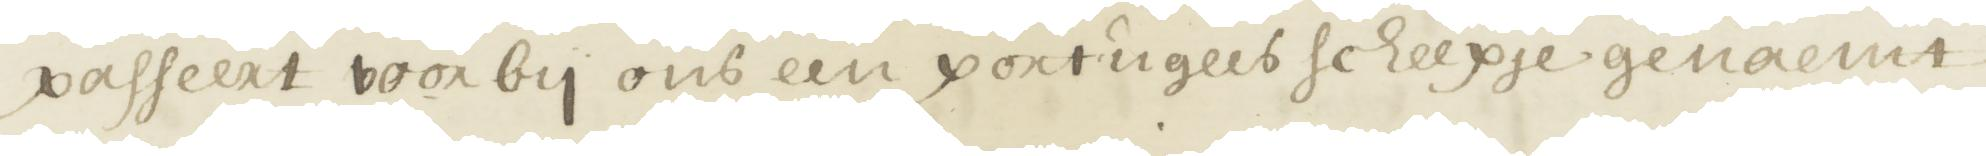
passeert voor bij ons een portugees scheepje genaemt
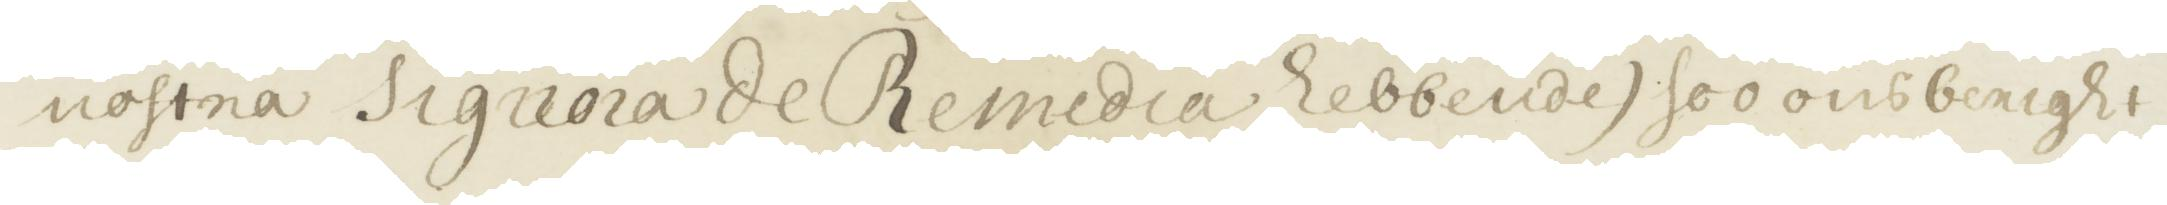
nostra Signora de Remedia hebbende) soo ons beright
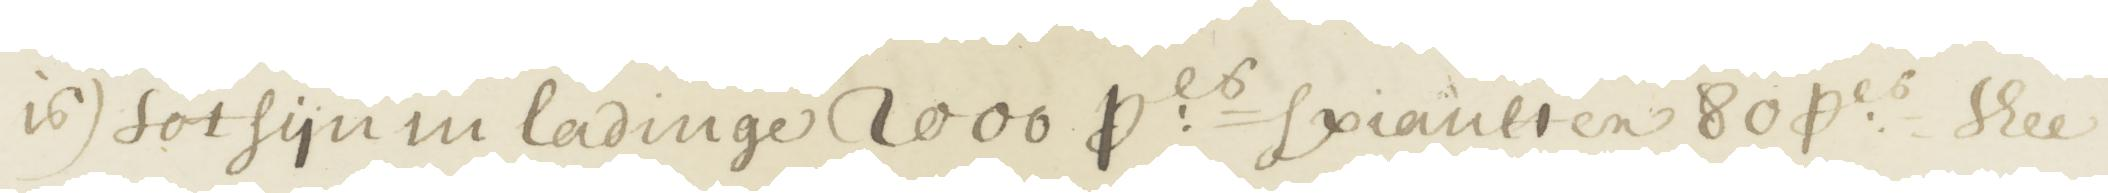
is) tot sijn in ladinge 2000 p:=es spiaulter 80 p:es= thee
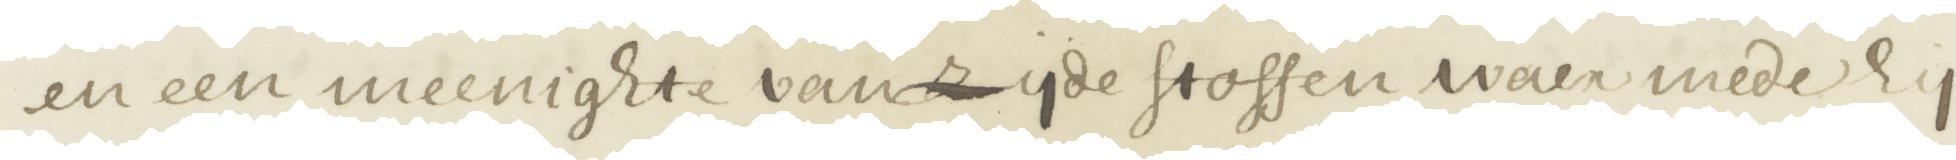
en een meenighte van zijde stoffen waer mede hij
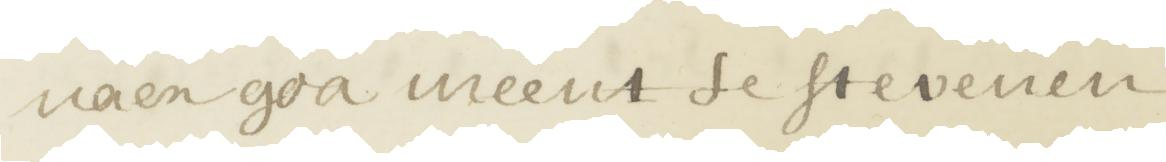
naer goa meent te stevenen
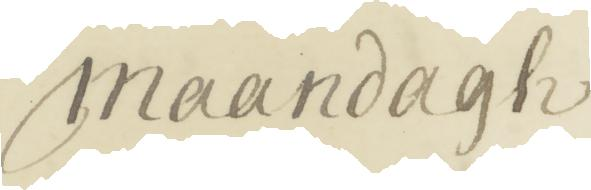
Maandagh
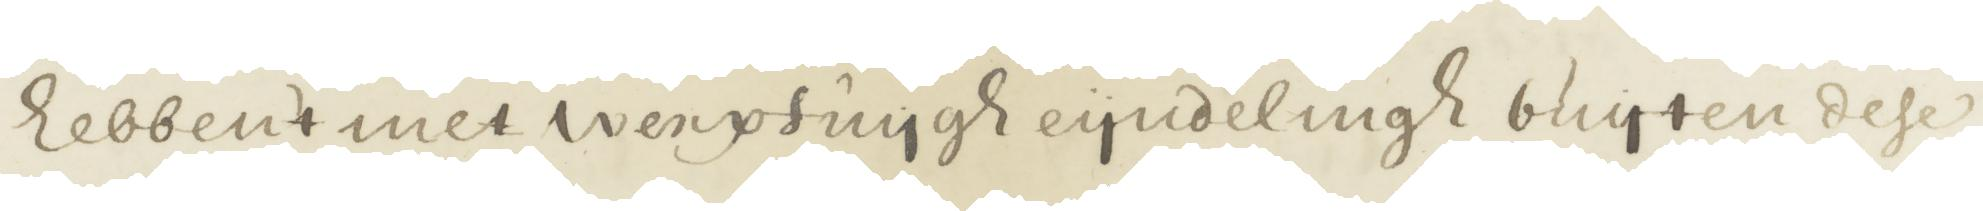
hebben 't met werptuijgh eijndelingh buijten dese
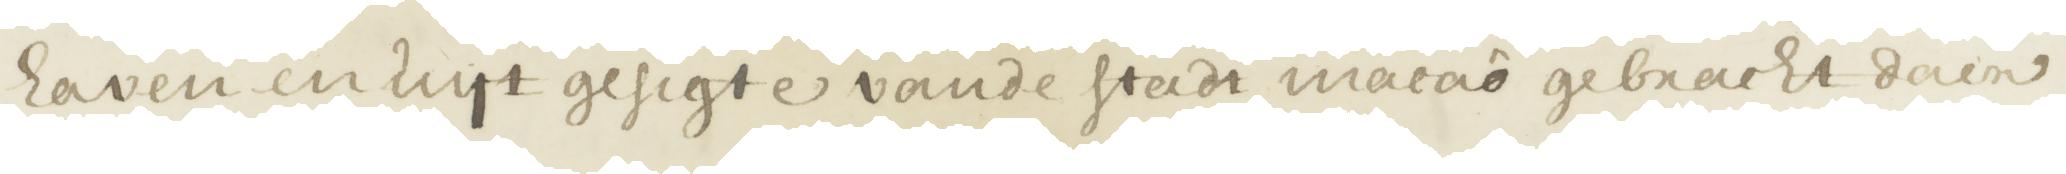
haven en uijt gesigte van de stadt macaô gebracht daer
